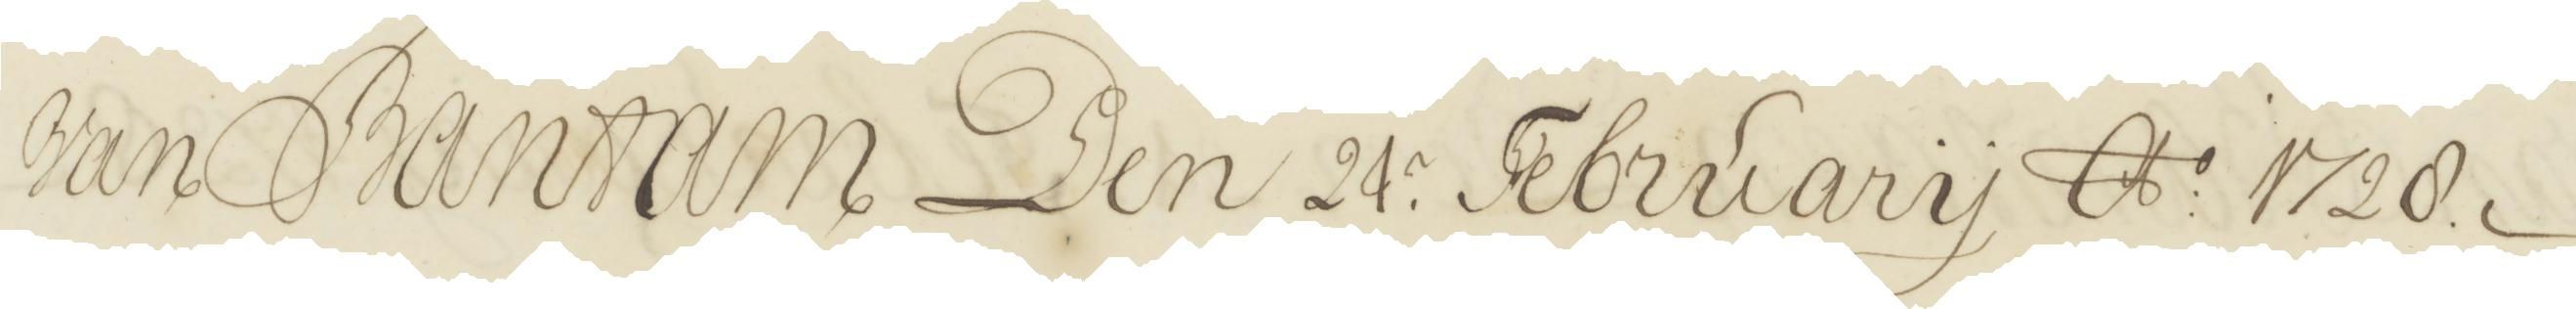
Van Bantam Den 24.' Februarij A:o 1728. _
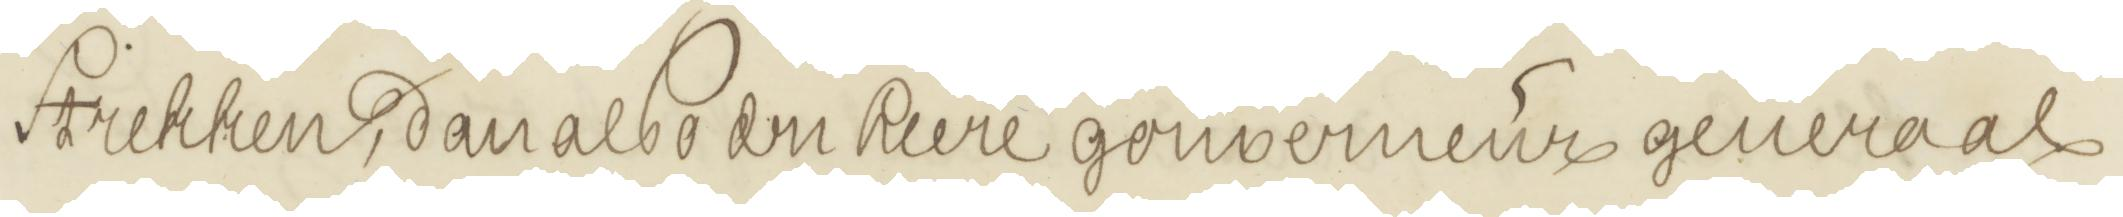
strekken, dan also den heere gouverneur generaal
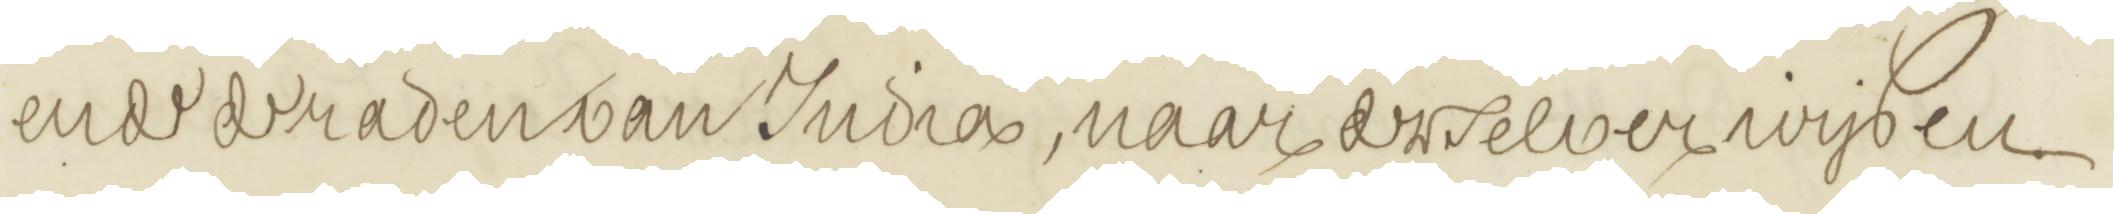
ende de raden van India, naar derselver wijsen
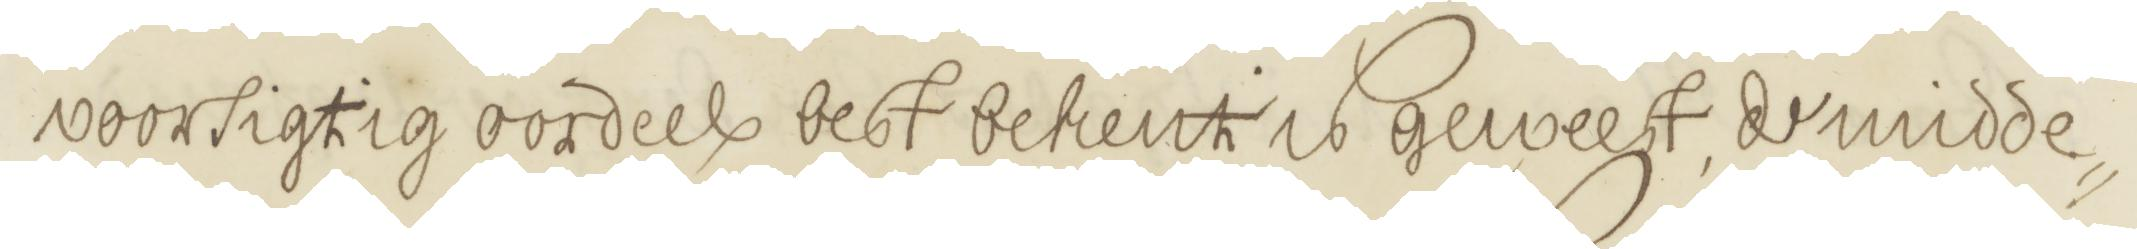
voorsigtig oordeel best bekent is geweest, de midde„
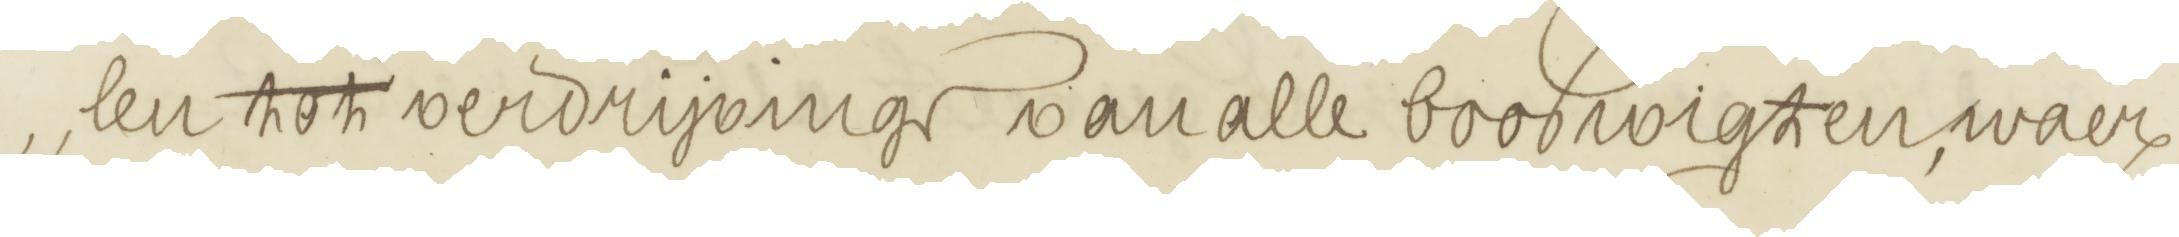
„len tot verdrijvings van alle booswigten, waer
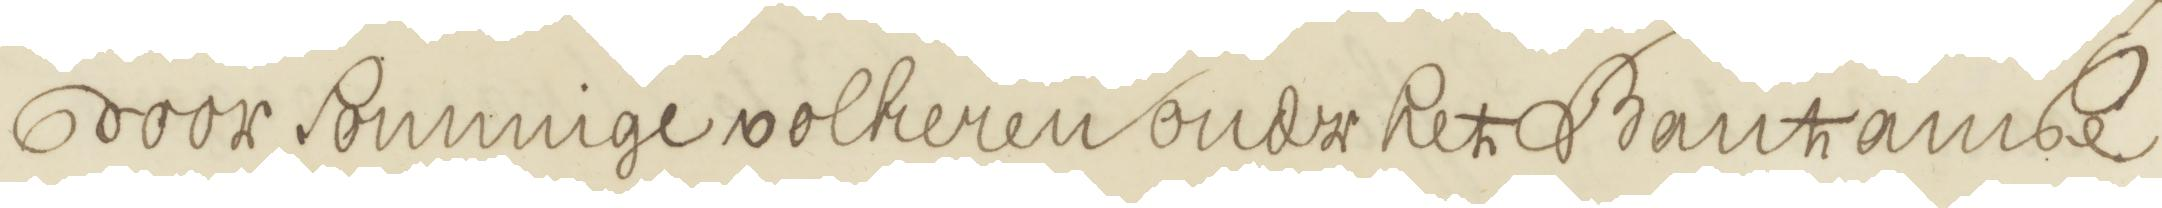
door sommige volkeren onder het Bantamse
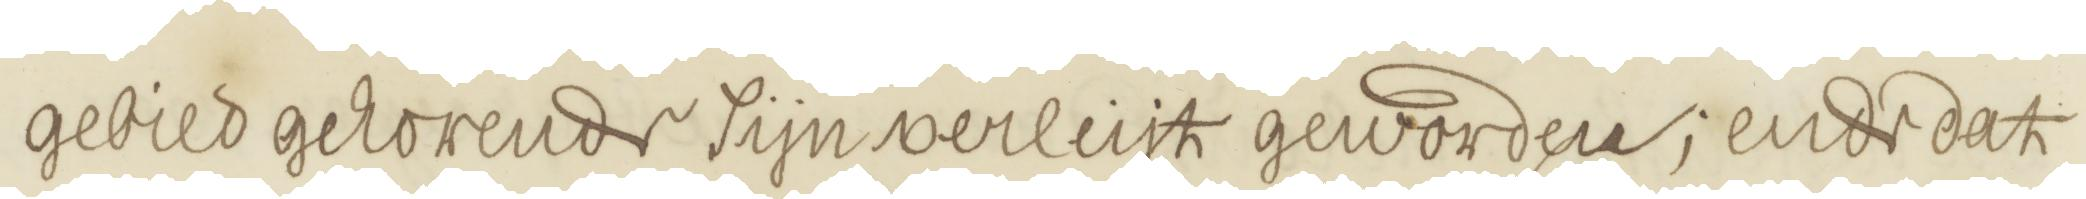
gebied gehorende sijn verleijt geworden; ende dat
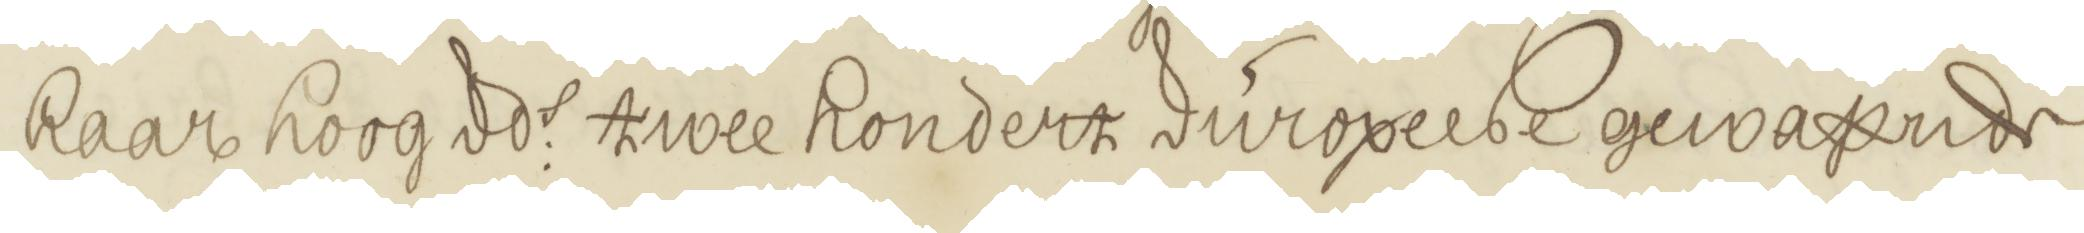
haar hoog Ed:s twee hondert Europeese gewapende
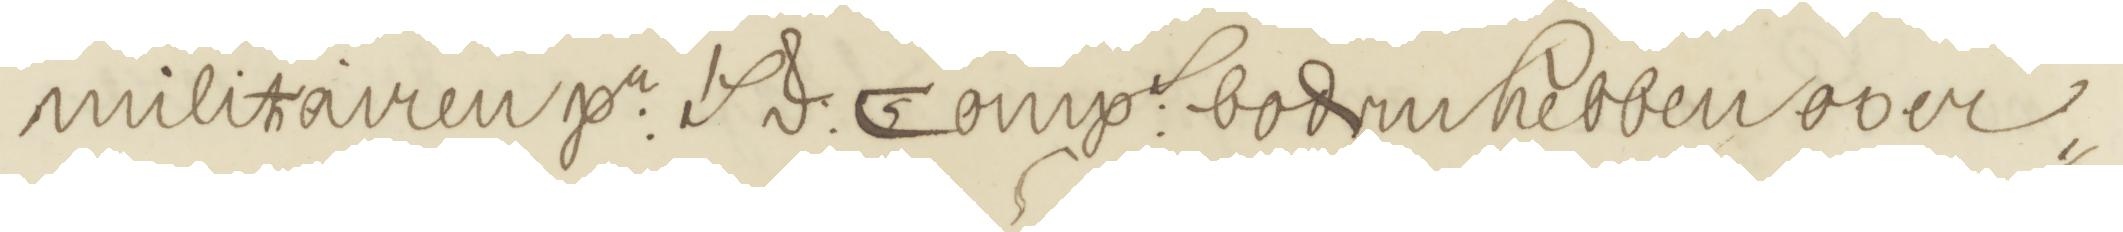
militairen p:r 's E: comp:s bodem hebben over „
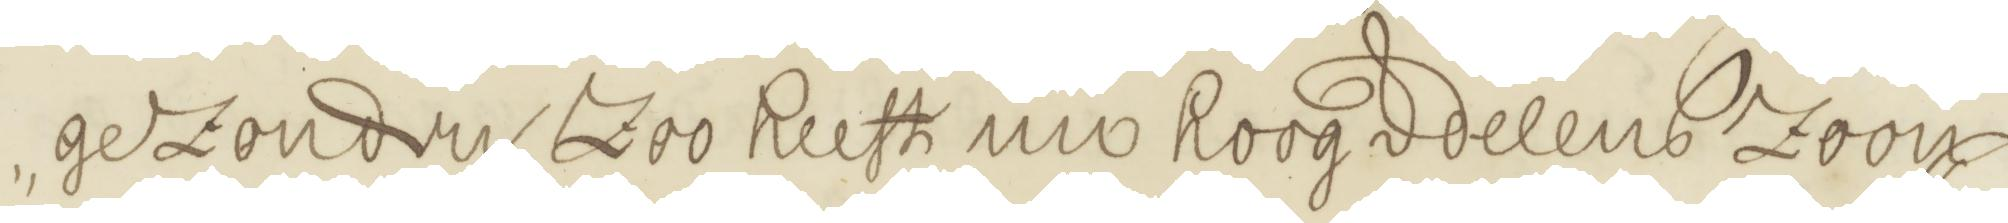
„gezonden zoo heeft uw hoog Edelens zoon
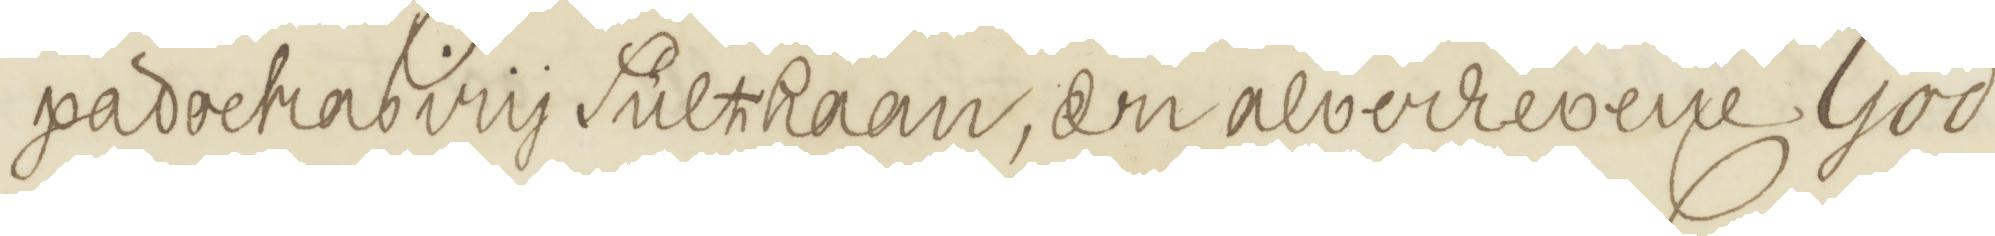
padoekasirij sulthaan, den alverhevere God
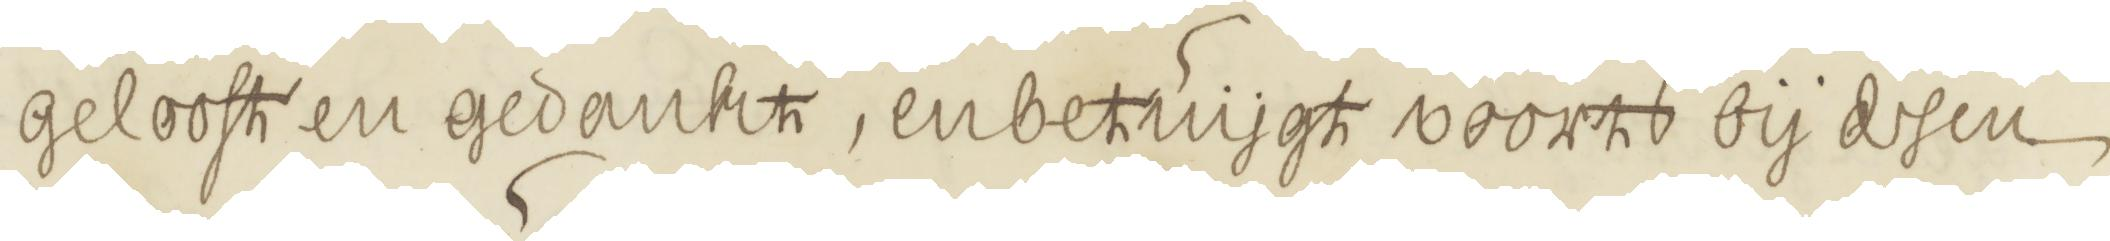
gelooft en gedankt, en betuijgt voorts bij desen
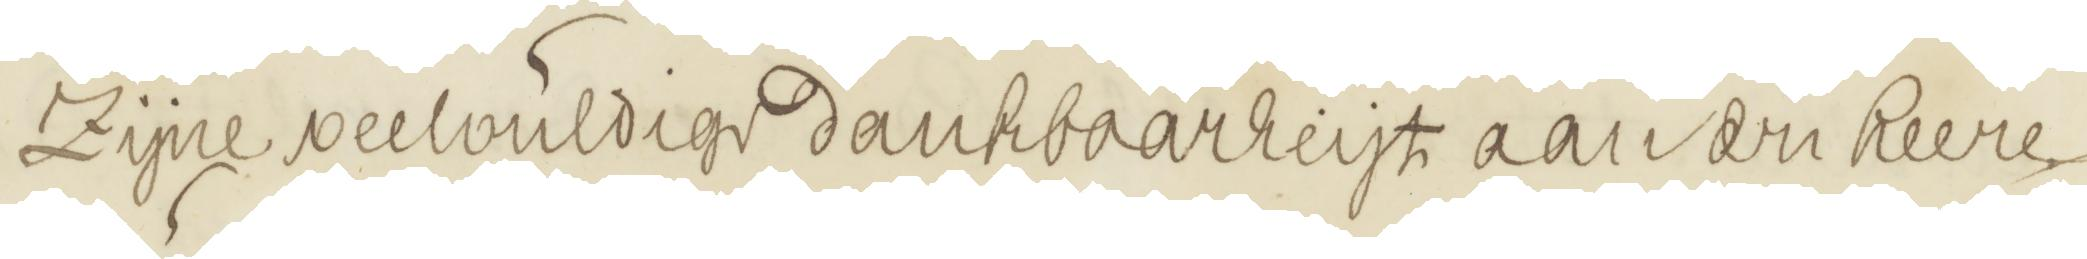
zijne veelvuldige dankbaarheijt aan den heere
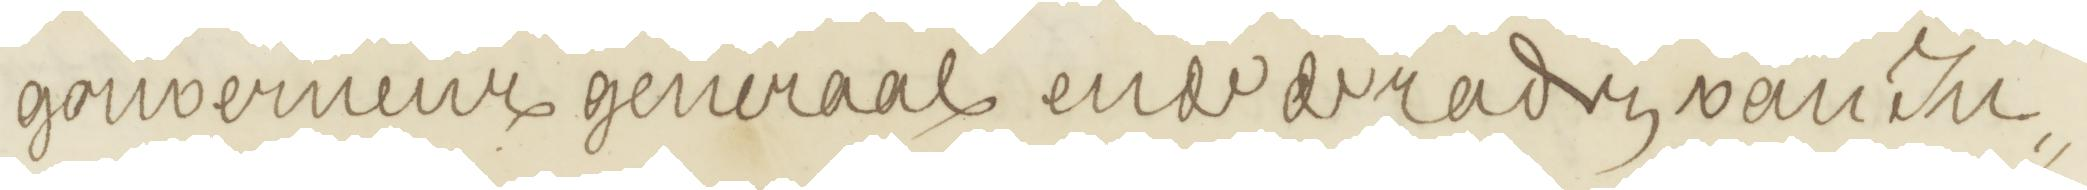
gouverneur generaal ende de raden van In„
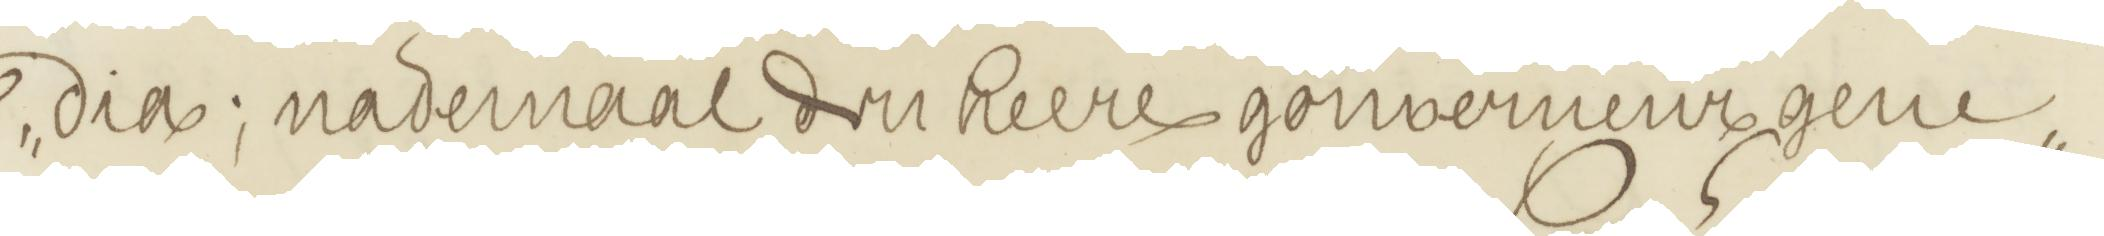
„dia; nademaal den heere gouverneur gene„
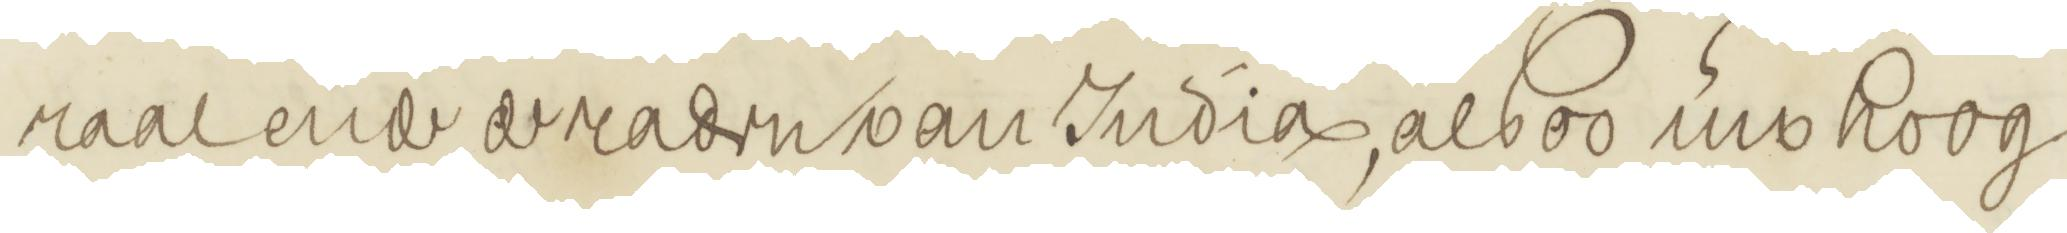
raal ende de raden van India, alsoo uw hoog
